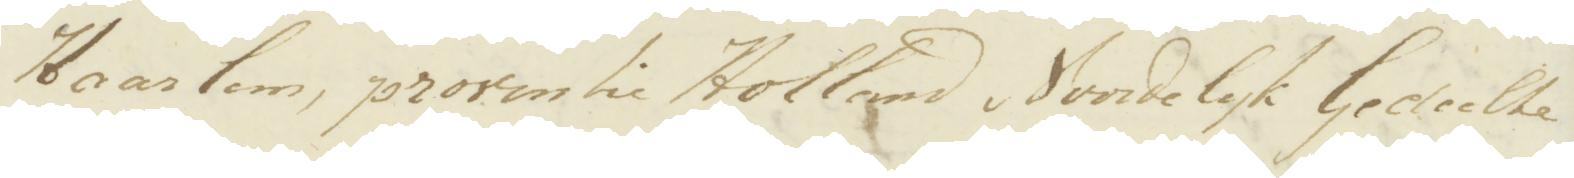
Haarlem, provintie Holland Noordelyk Gedeelte
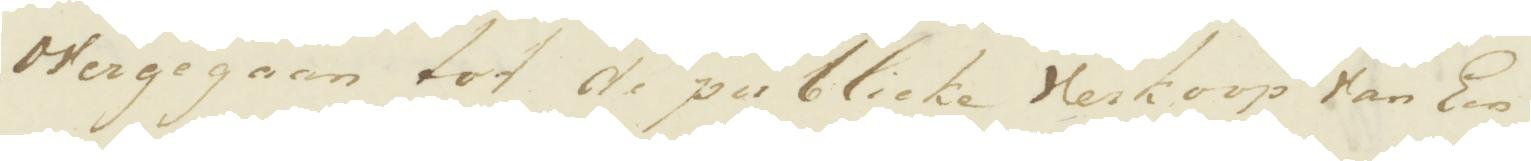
overgegaan tot de publieke verkoop van Een
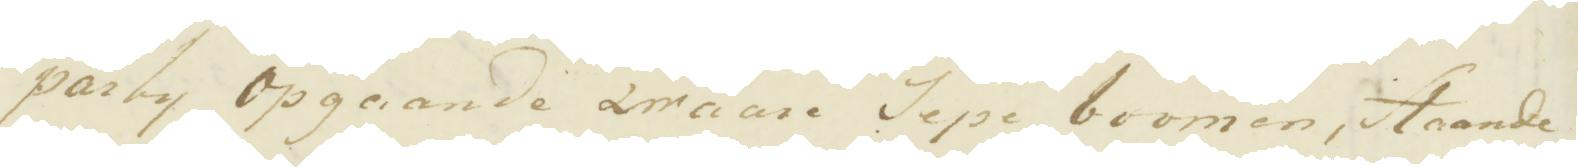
party opgaande zwaare Iepe boomen, Staande
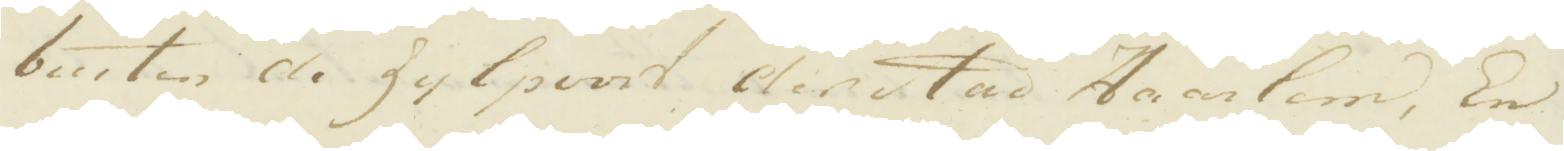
buiten de Zylpoort der stad Haarlem, En
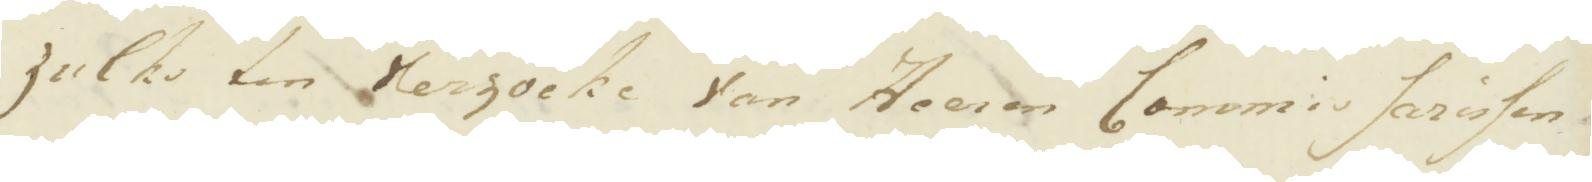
zulks ten verzoeke van Heeren Commissarissen
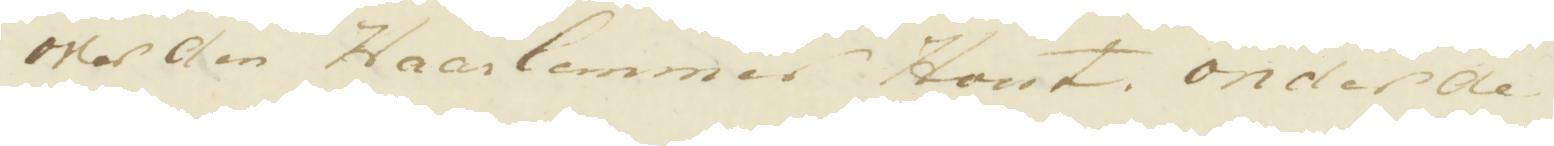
over den Haarlemmer Hout. onder de
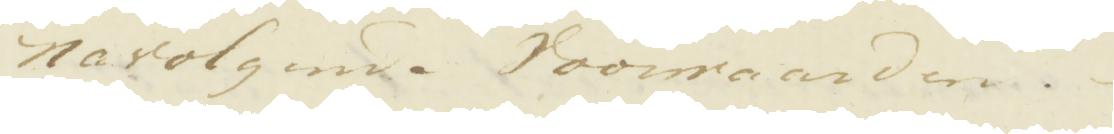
navolgende Voorwaarden.
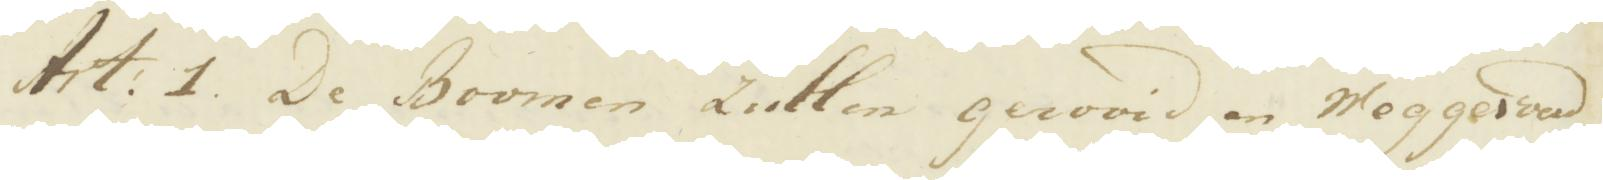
Art: 1. De Boomen zullen gerooid en weggevoerd
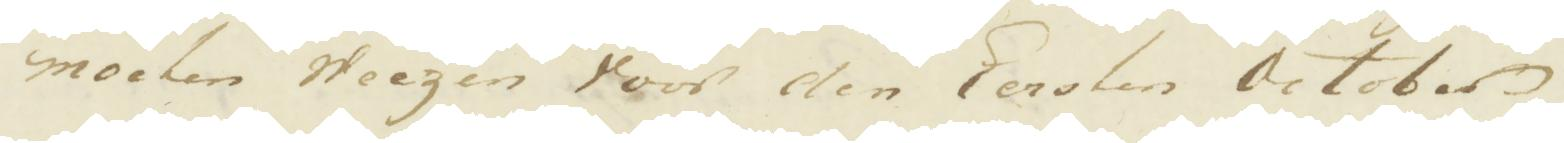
moeten weezen voor den Eersten October
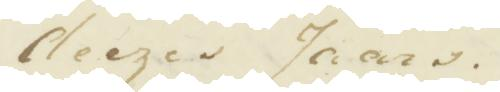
deezes Jaars.
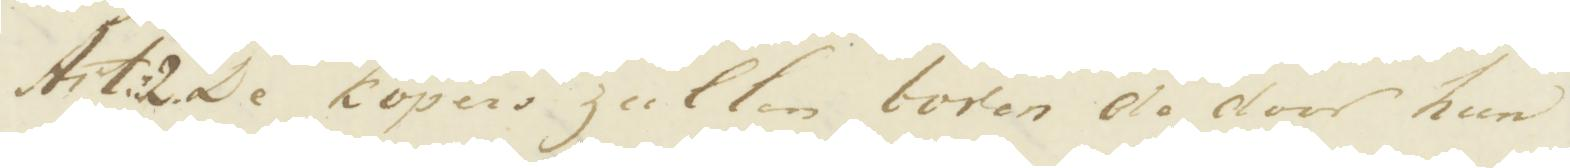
Art: 2. De kopers zullen boven de door hun
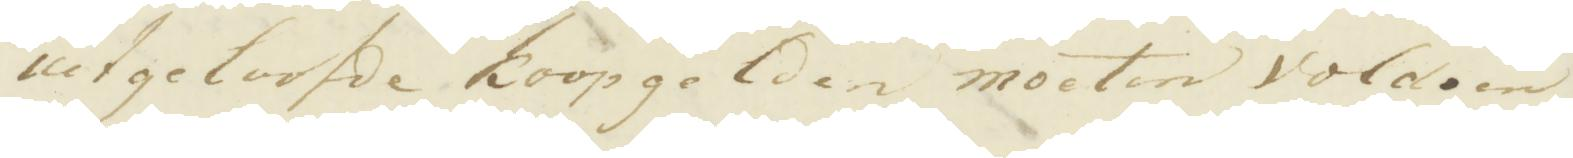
uitgeloofde koopgelden moeten voldoen
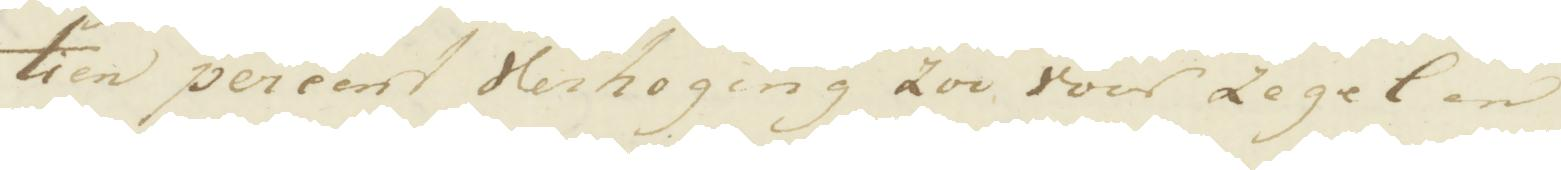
tien percent verhoging zoo voor zegel en
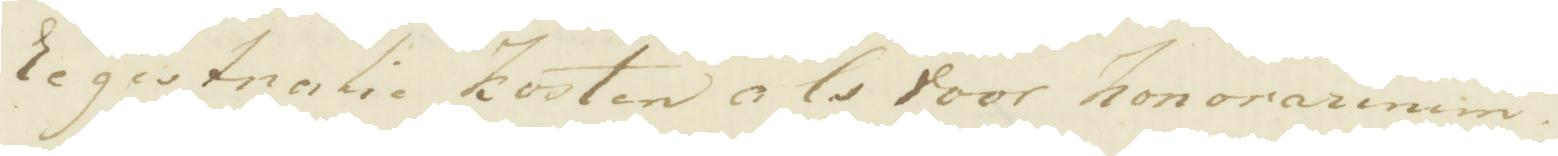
registratie kosten als voor honorarium
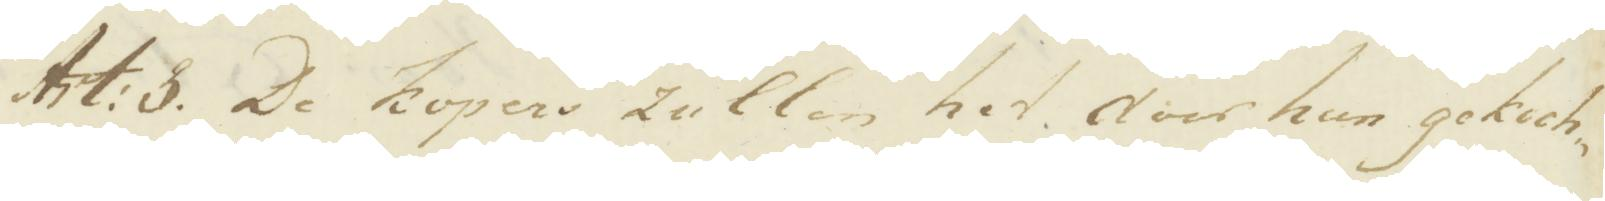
Art: 3. De Kopers zullen het door hun gekoch„
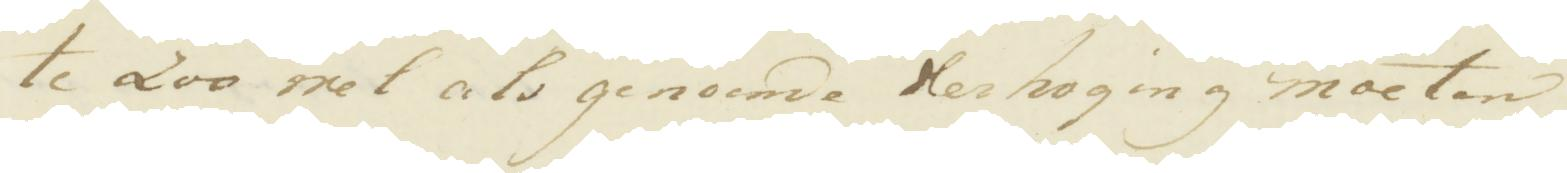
te zoo wel als genoemde verhoging moeten
